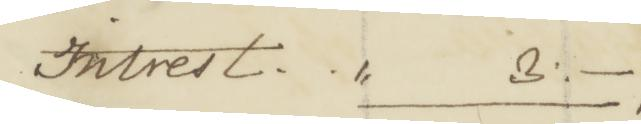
Intrest . . „ 3: —
